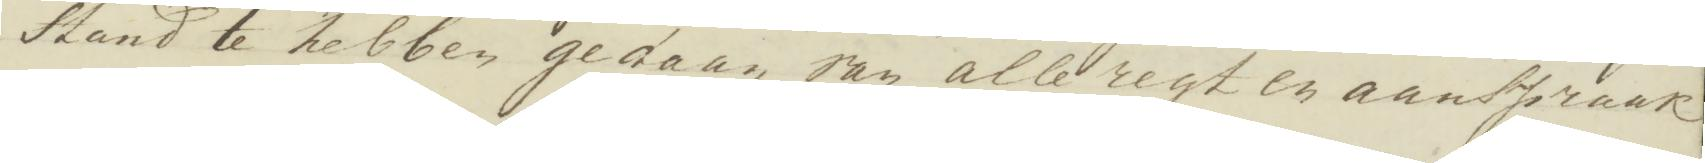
stand te hebben gedaan van alle regt en aanspraak
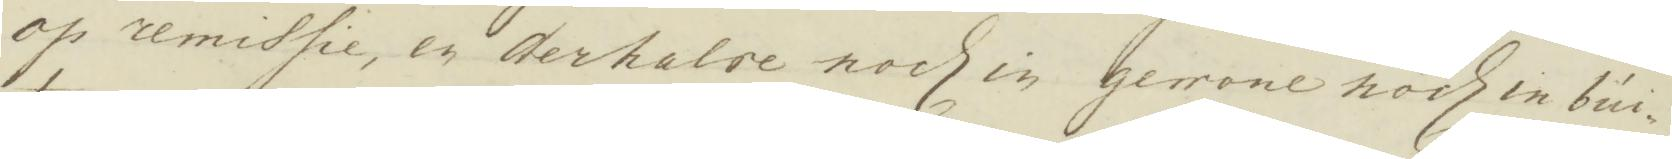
op remissie, en derhalve noch in gewone noch in bui„
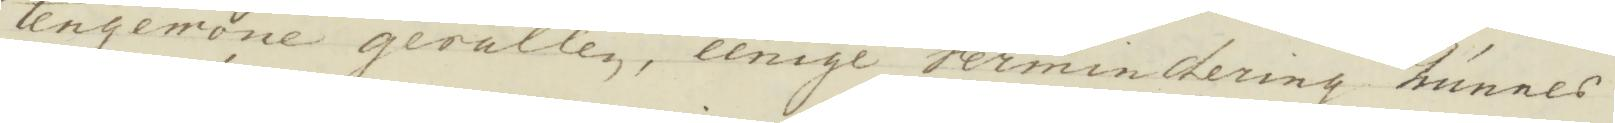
tengewone gevallen, eenige vermindering hunner
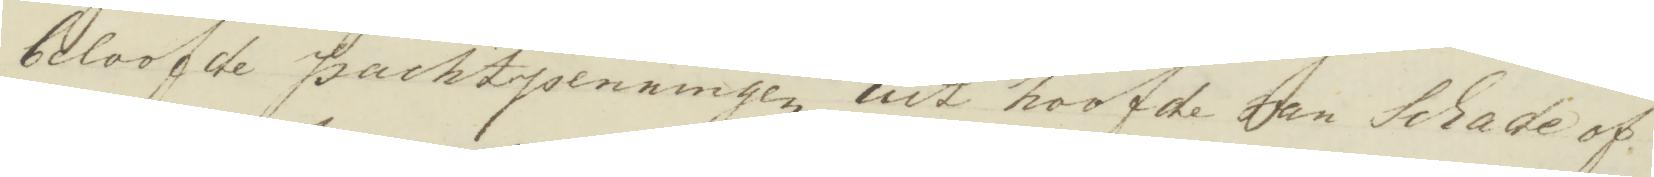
beloofde pachtpenningen uit hoofde van schade of
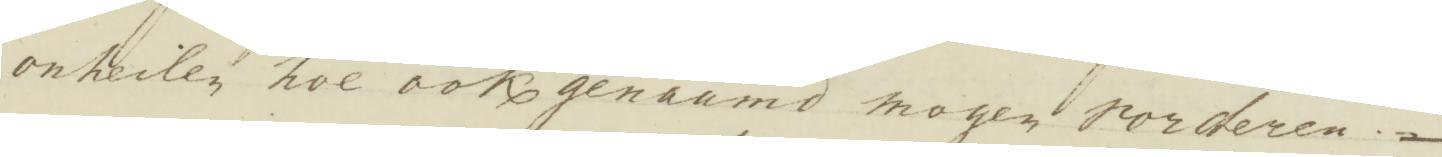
onheilen hoe ook genaamd mogen vorderen .-
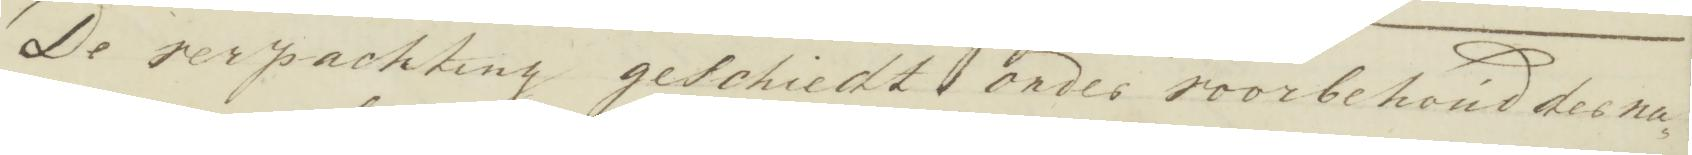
De verpachting geschiedt onder voorbehoud der na„
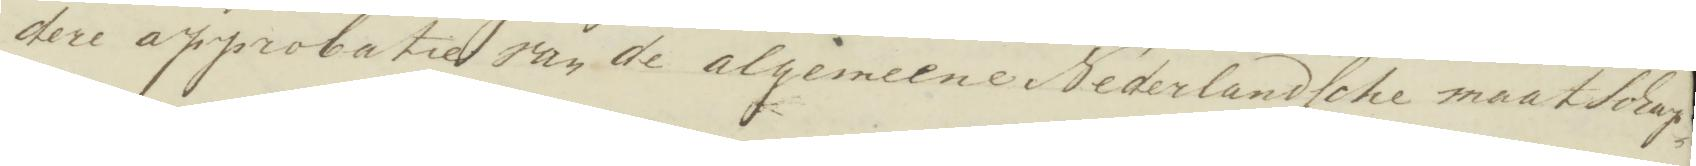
dere approbatie van de algemeene Nederlandsche maatschap„
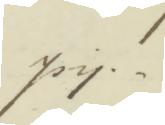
pij.
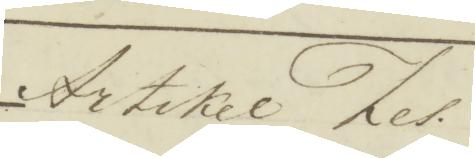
-Artikel zes.
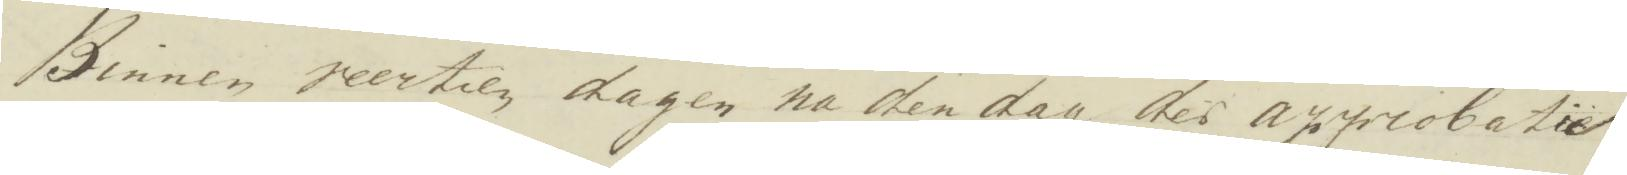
Binnen veertien dagen na den dag der approbatie
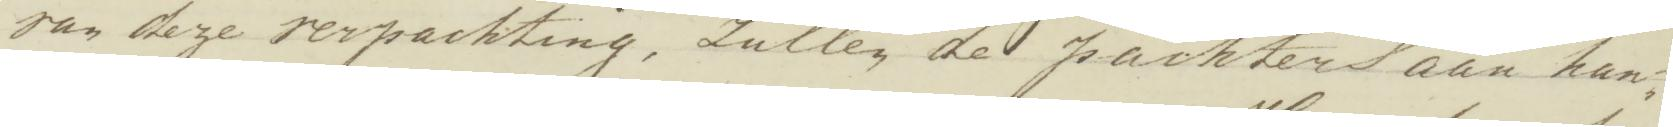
van deze verpachting, zullen de pachters aan han„
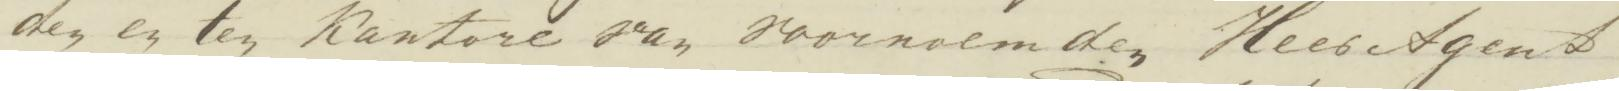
den en ten kantore van voornoemden Heer Agent
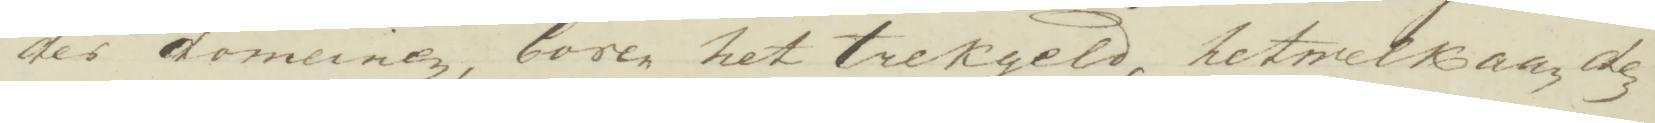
der domeinen, boven het trekgeld, hetwelk aan den
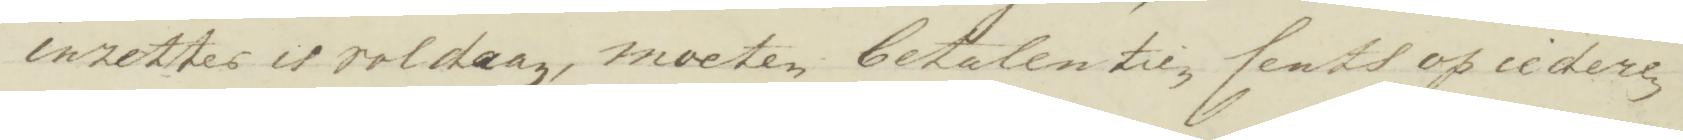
inzetter is voldaan, moeten betalen tien Cents op iederen
